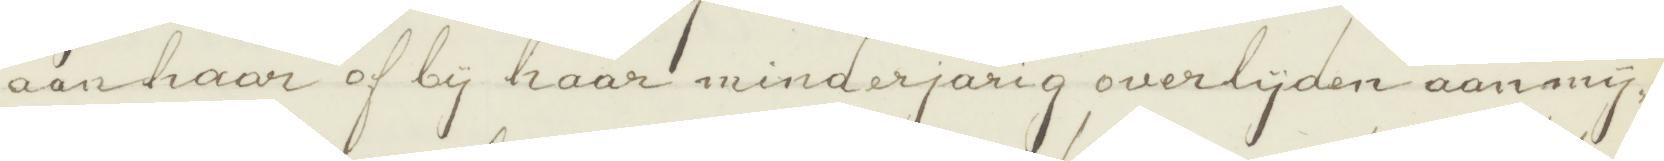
aan haar of bij haar minderjarig overlijden aan mij„
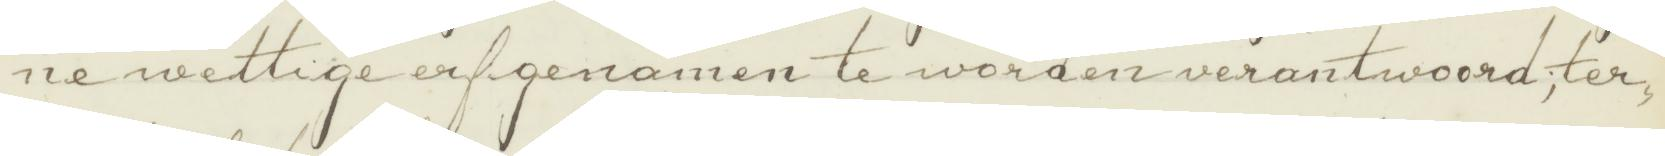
ne wettige erfgenamen te worden verantwoord; ter„
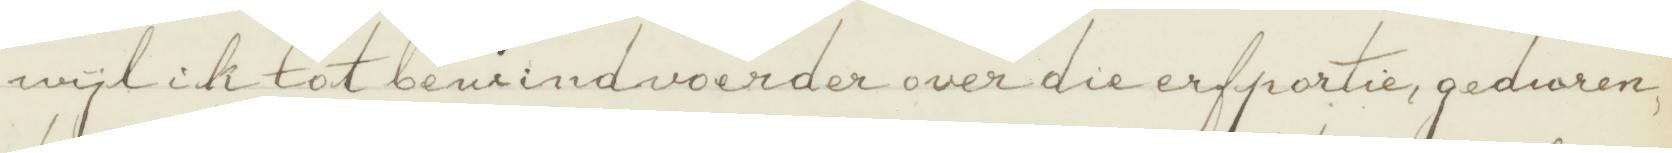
wijl ik tot bemindvoerder over die erfportie, geduren,
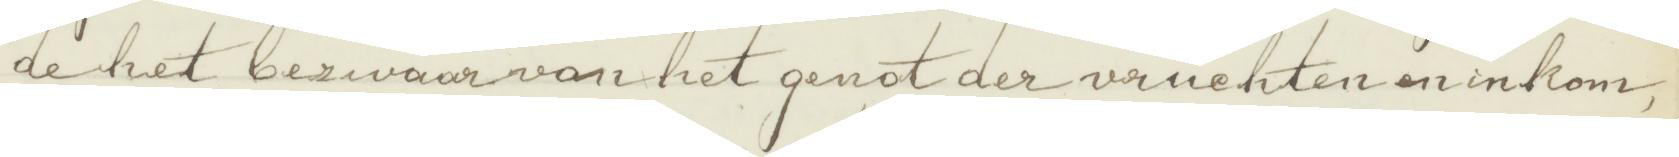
de het bezwaar van het genot der vruchten en inkom„
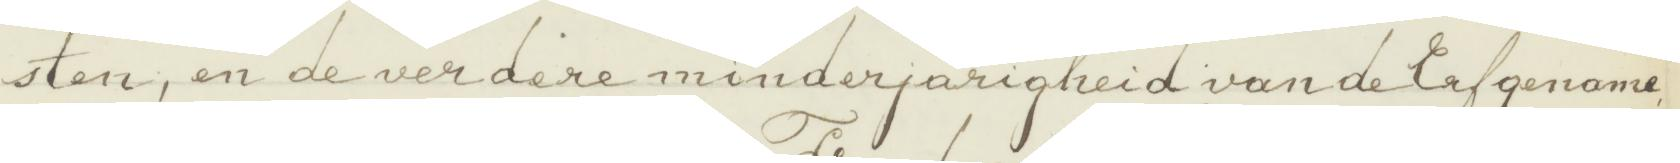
sten, en de verdere minderjarigheid van de Erfgename
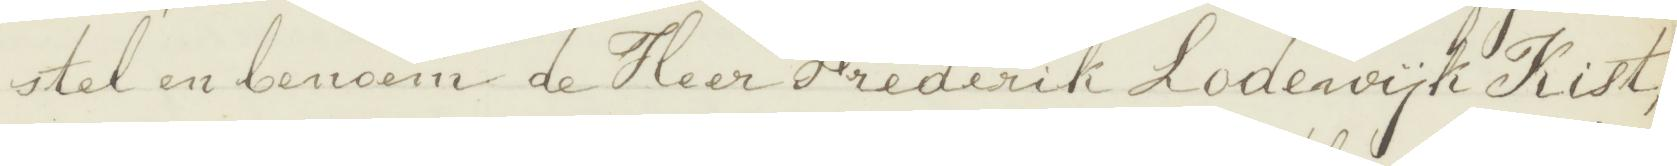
stel en benoem de Heer Frederik Lodewijk Kist,
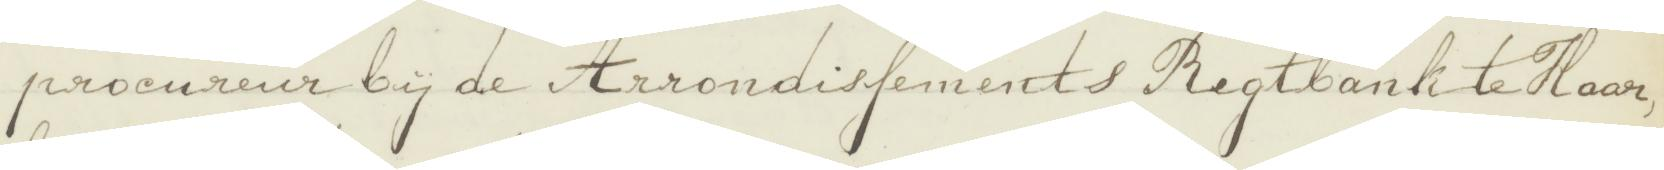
procureur bij de Arrondissements Regtbank te Haar,
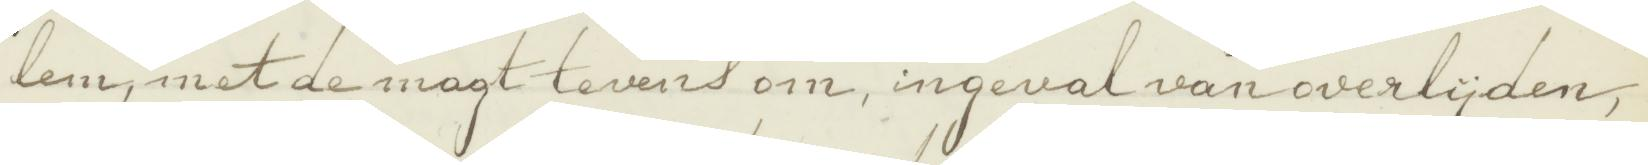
lem, met de magt tevens om, ingeval van overlijden,
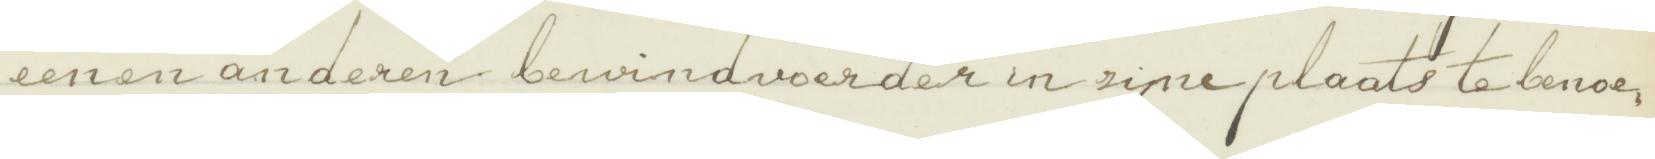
eenen anderen bewindvoerder in zijne plaats te benoe„
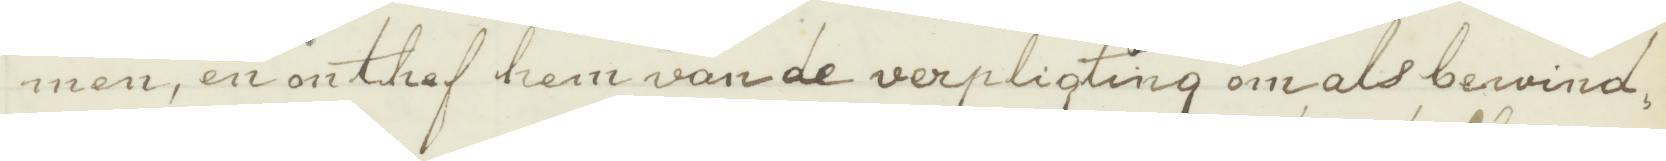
men, en onthef hem van de verpligting om als bewind„
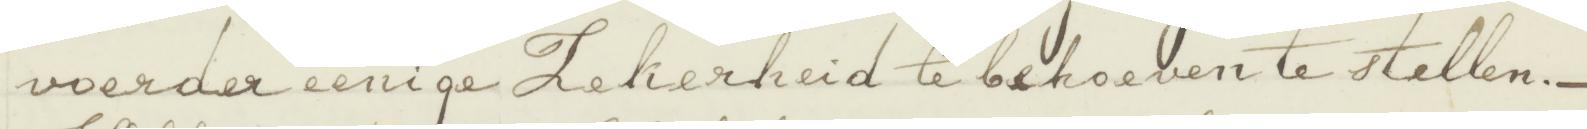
voerder eenige Zekerheid te behoeven te stellen._
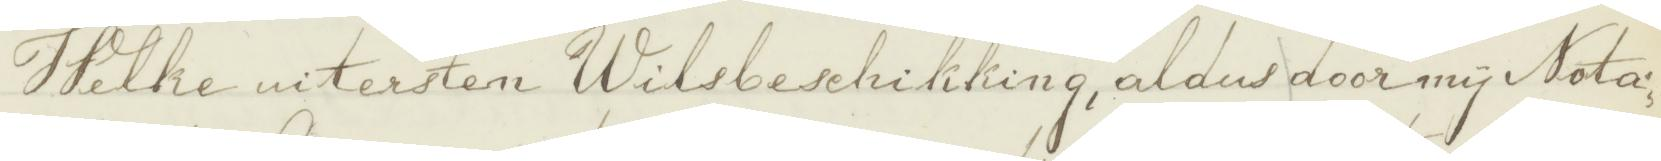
Welke uitersten Wilsbeschikking, aldus door mij Nota„
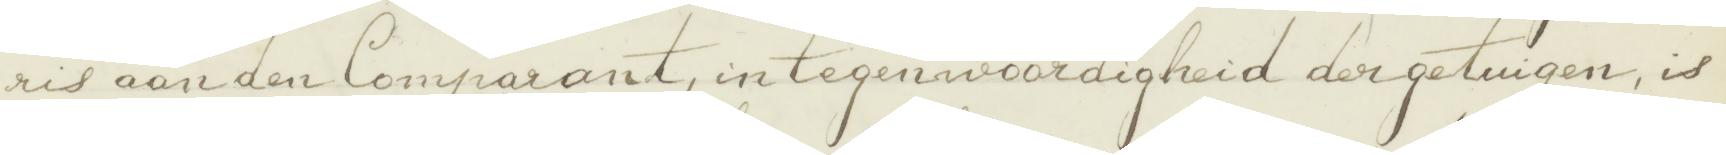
ris aan den Comparant, in tegenwoordigheid der getuigen, is
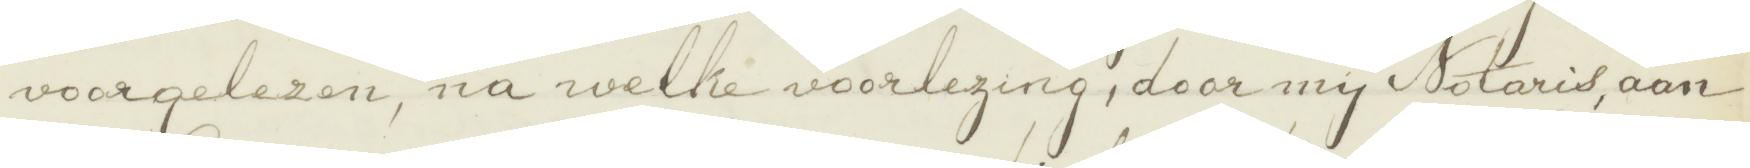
voorgelezen, na welke voorlezing, door mij Notaris, aan
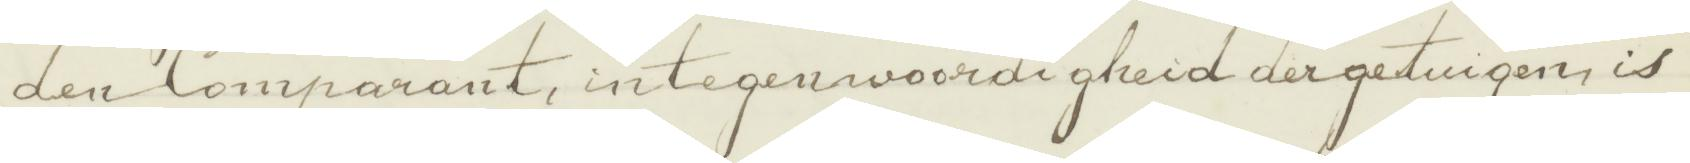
den Comparant, in tegenwoordigheid der getuigen, is
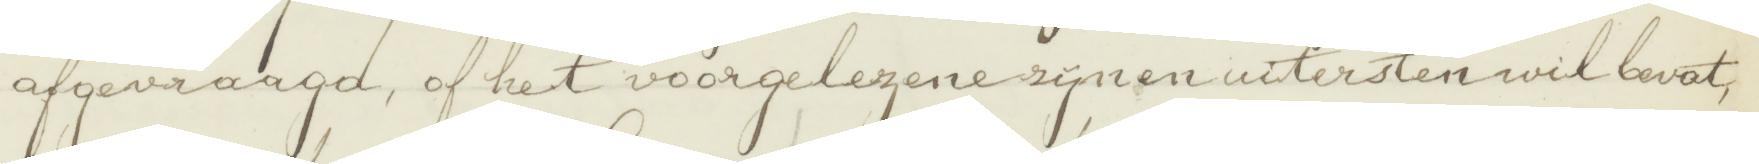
afgevraagd, of het voorgelezene zijn en uitersten wil bevat,
